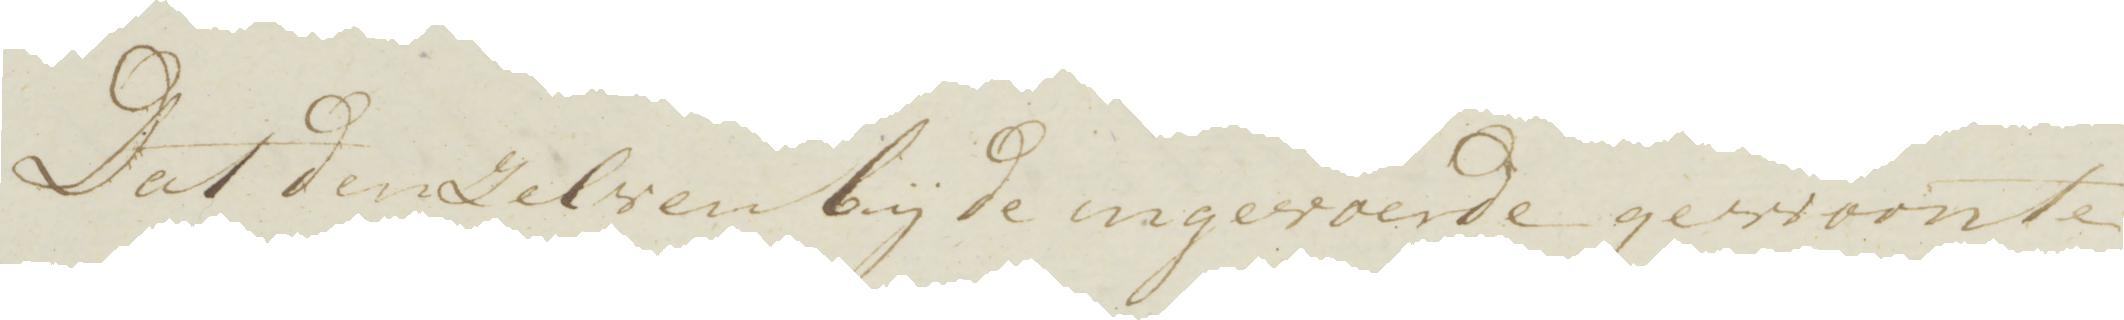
Dat denzelven bij de ingevoerde gewoonte
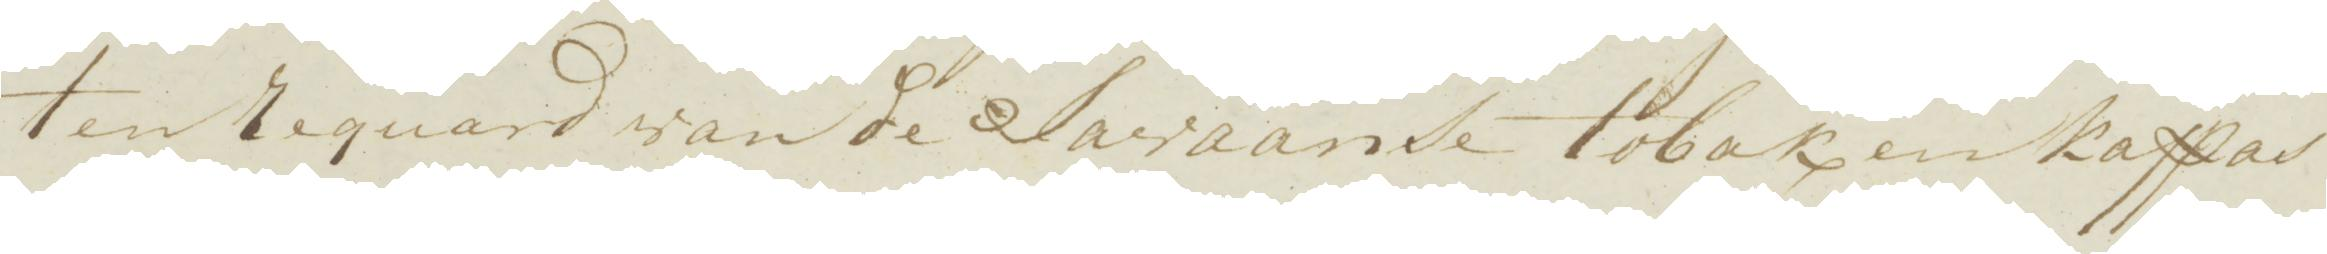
ten requard van de Iavaanse tobak en kappas
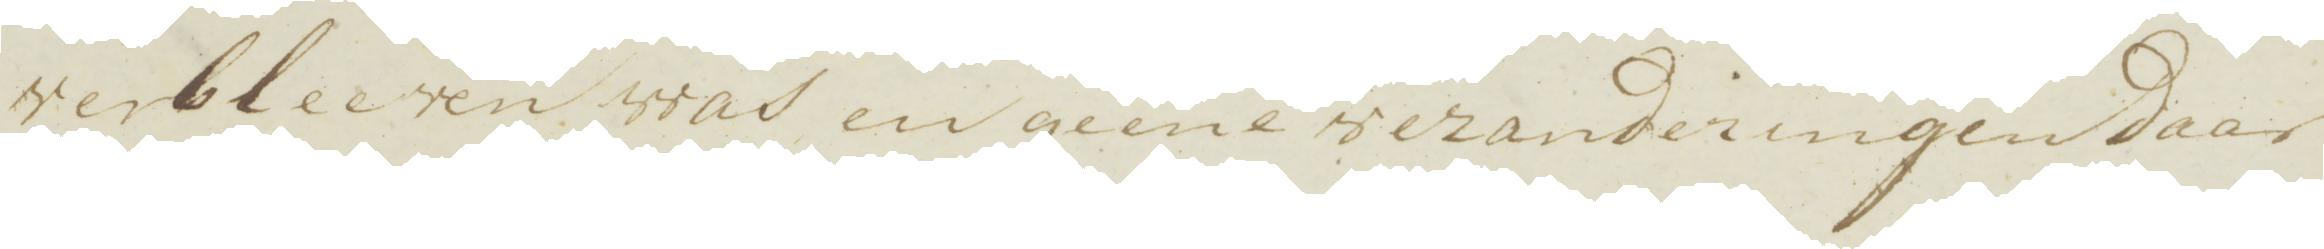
verbleeven was en geene veranderingen daar
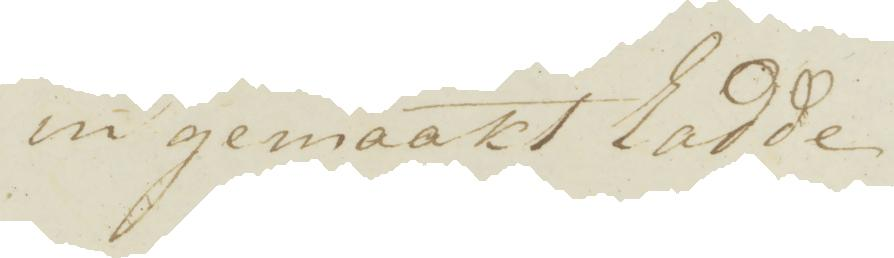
in gemaakt hadde
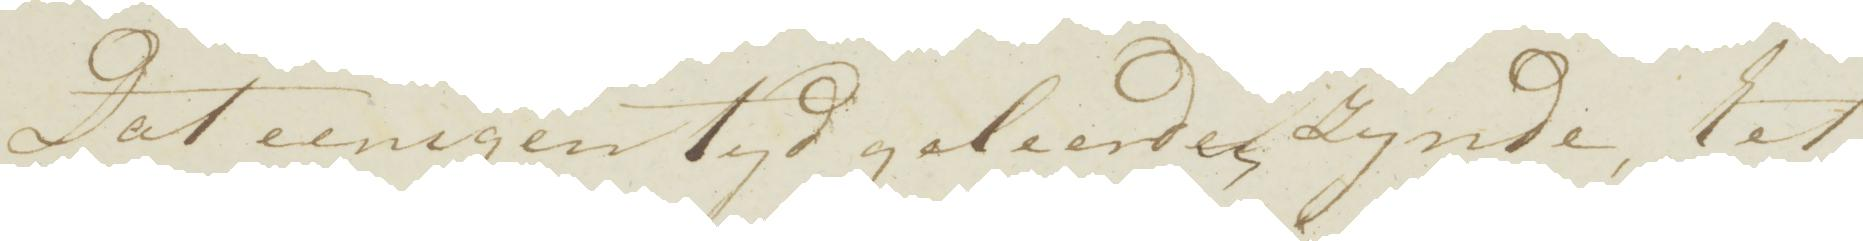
Dat eenigen tyd geleerden zynde, het
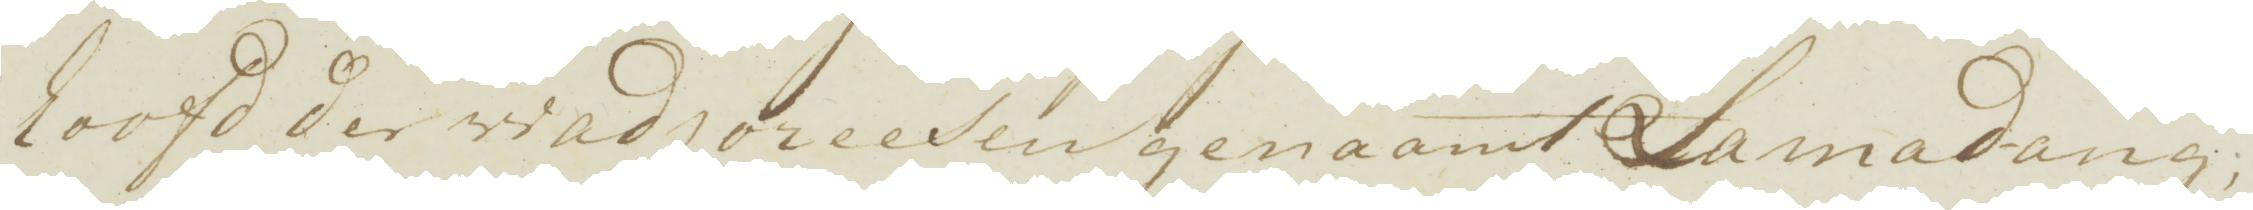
hoofd der wadjoreesen genaamt Samadang
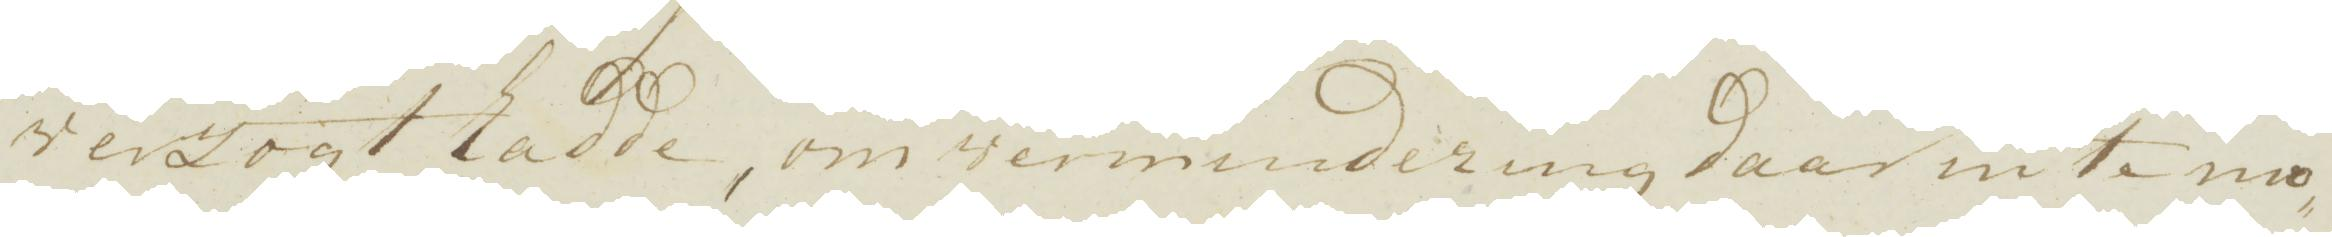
verzogt hadde, om vermindering daar in te mo„
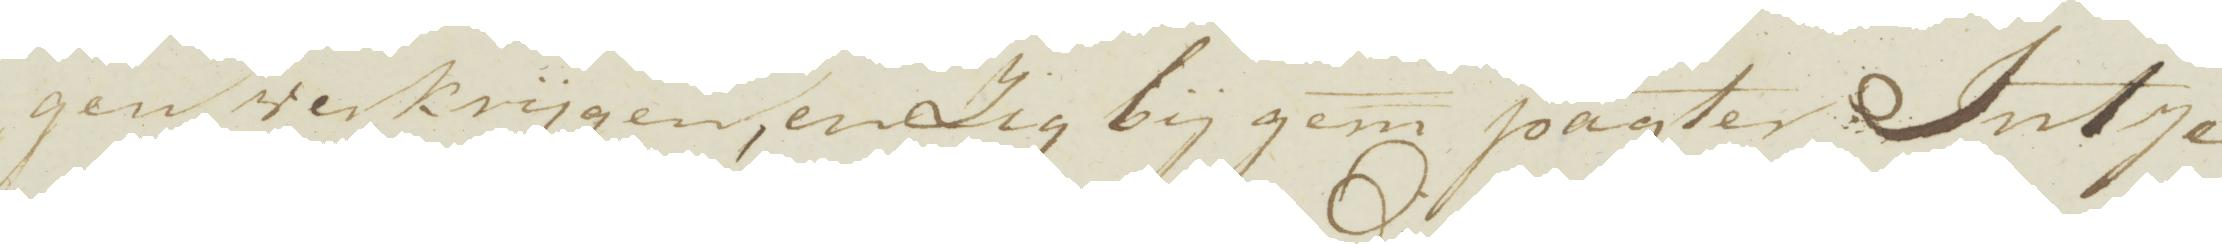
gen verkrijgen, en zig bij gem pagter Intje
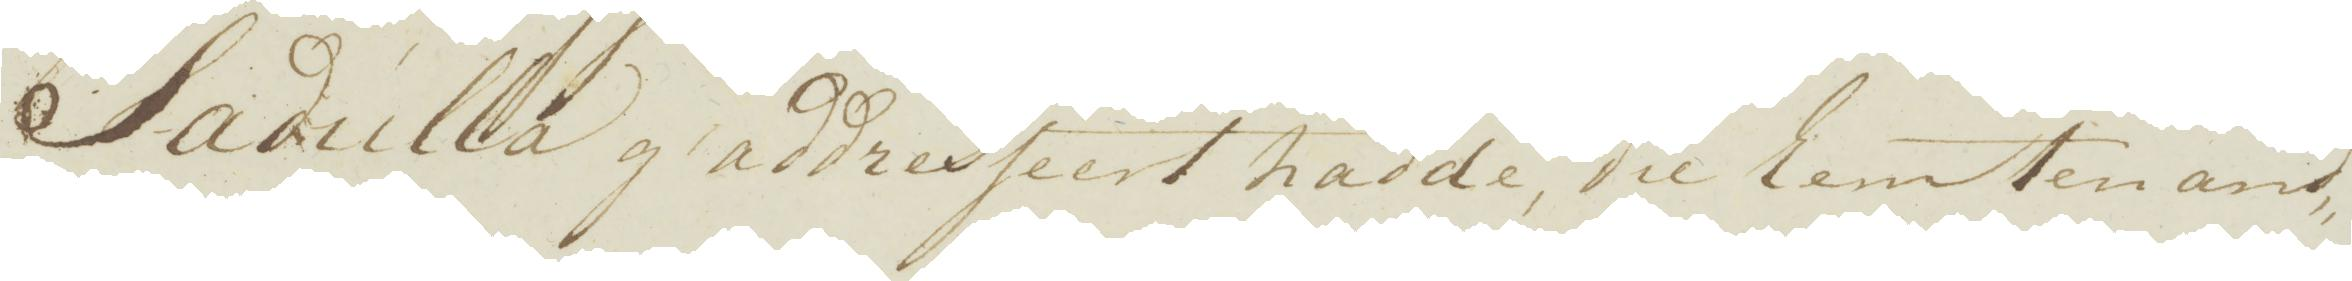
Sadulla g’addresseert hadde, die hem ten and„
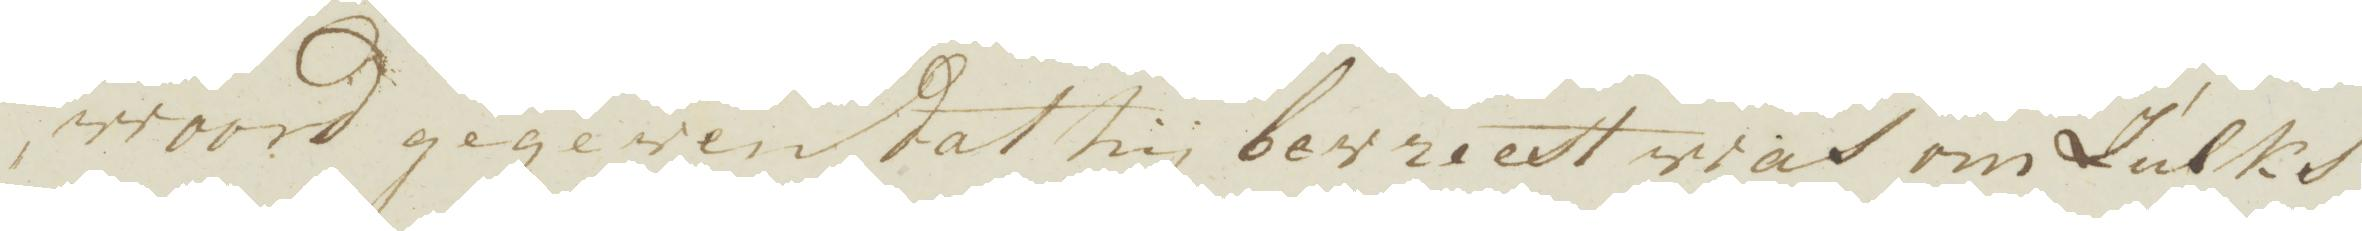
„woord gegeven, dat hij bevreest was om zulks
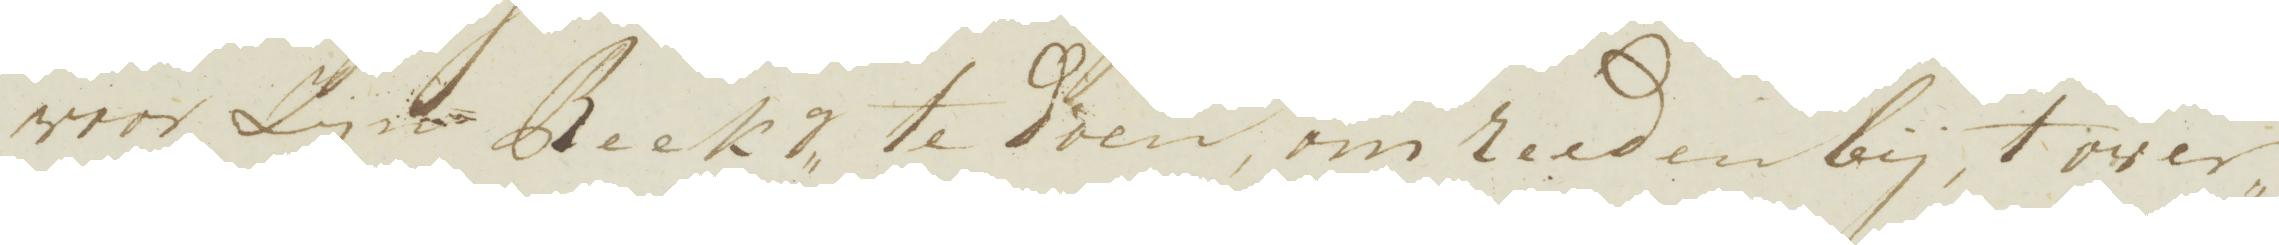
voor zijn Reeks„ te doen, om reeden bij, t over„
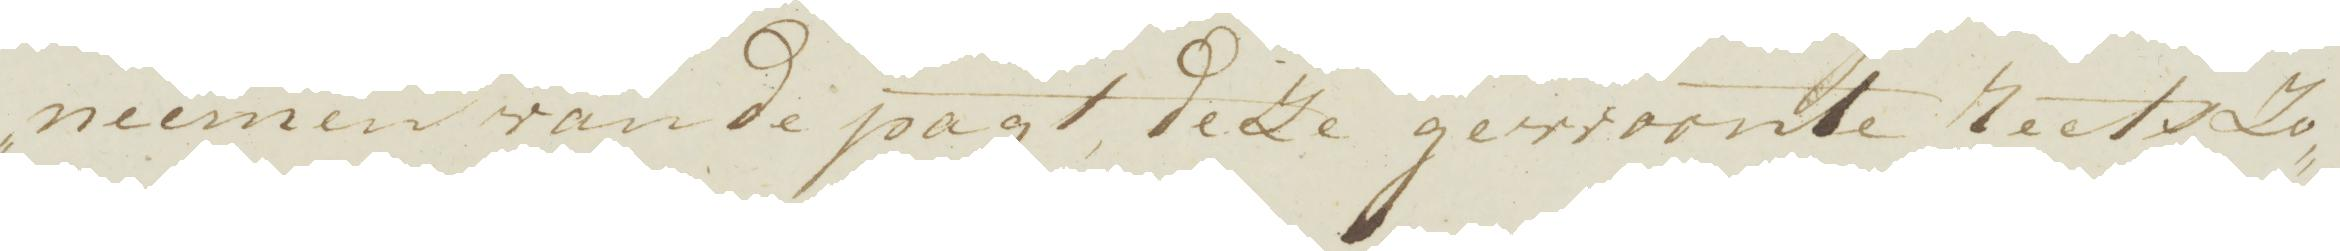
neemen van de pagt, deze gewoonte reets zo„
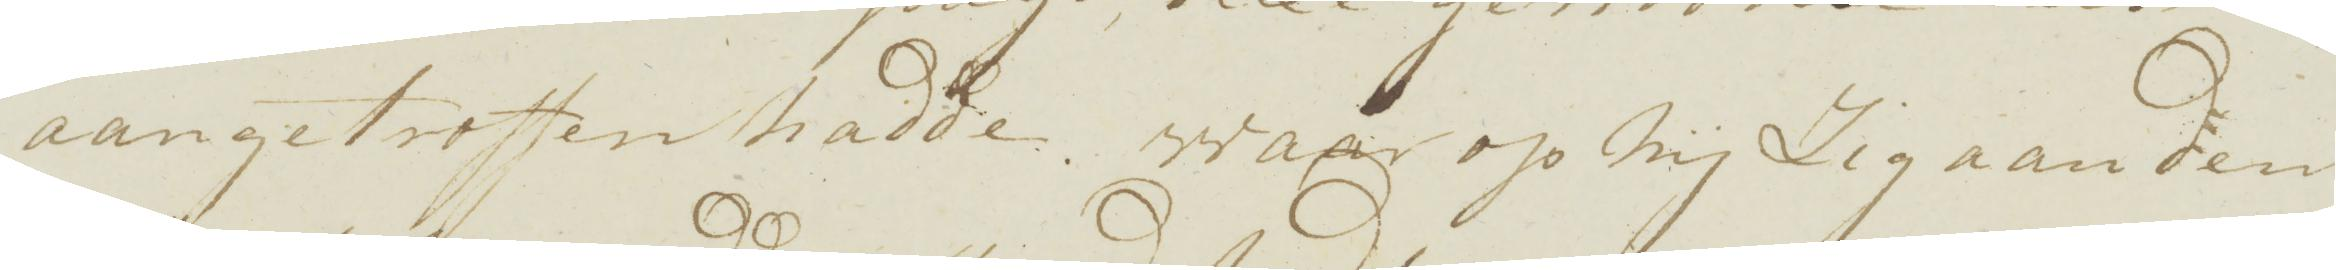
aangetroffen hadde. waar op hij zig aan den
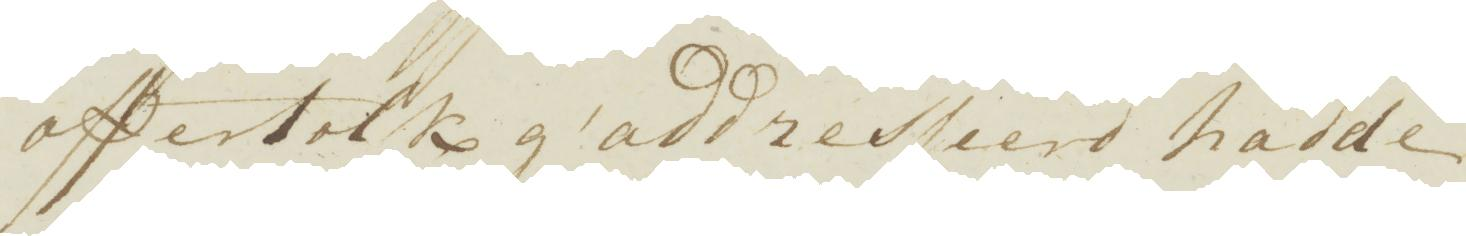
oppertolk g’addresseerd hadde
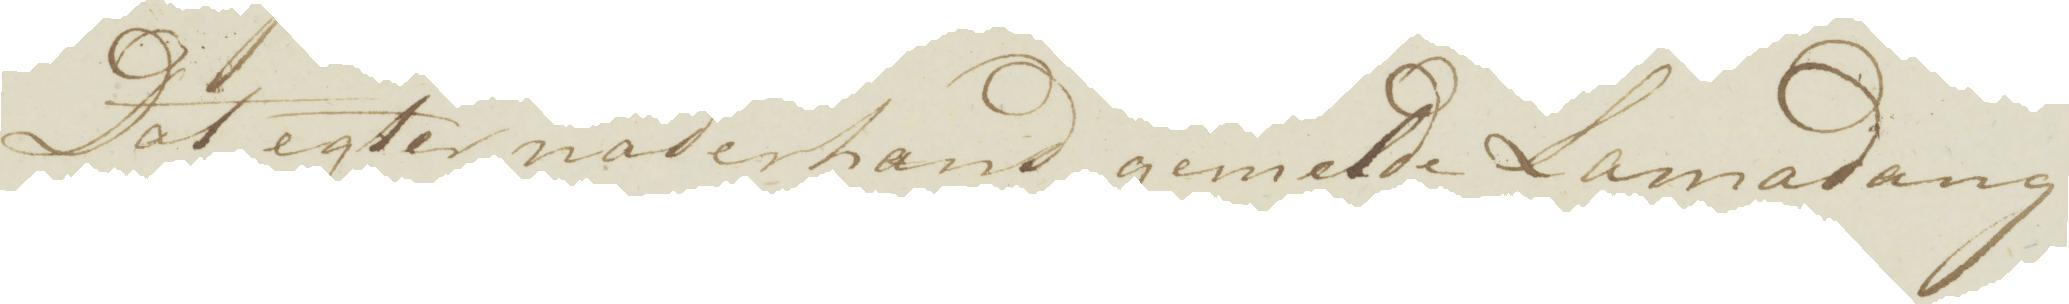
Dat egter naderhand gemelde Lamadang
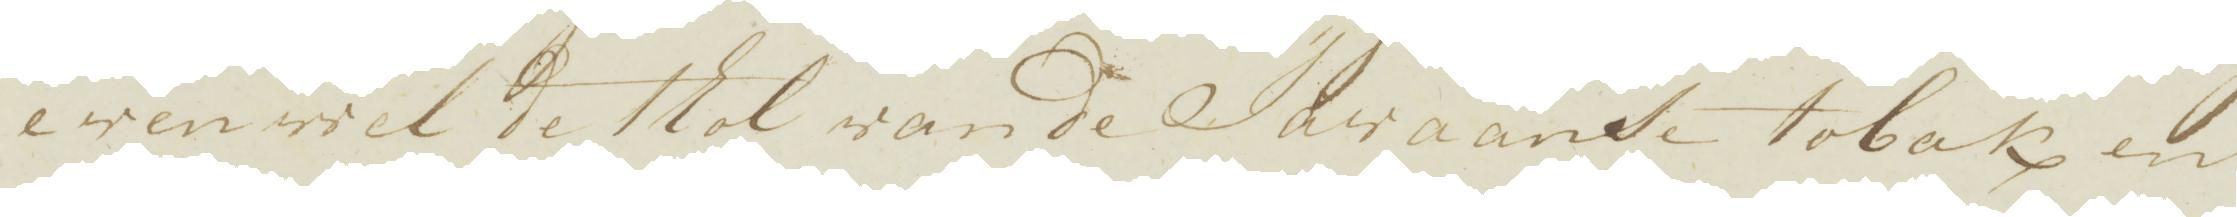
even wel de thol van de Iavaanse tobak en
